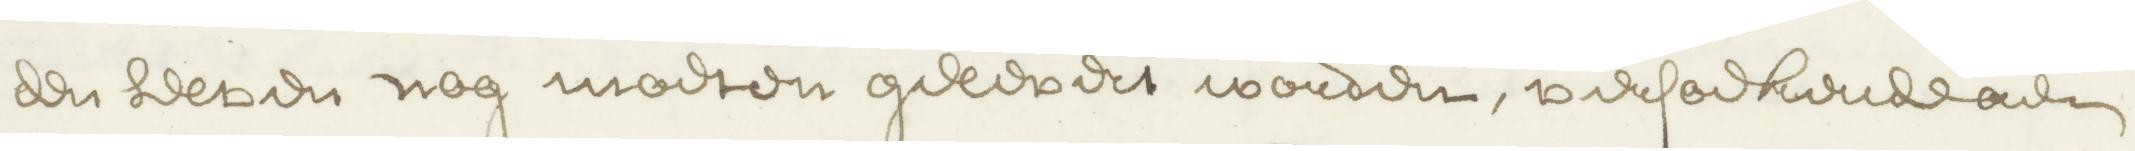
den selven nog moeten gelevert worden, versoekende aen
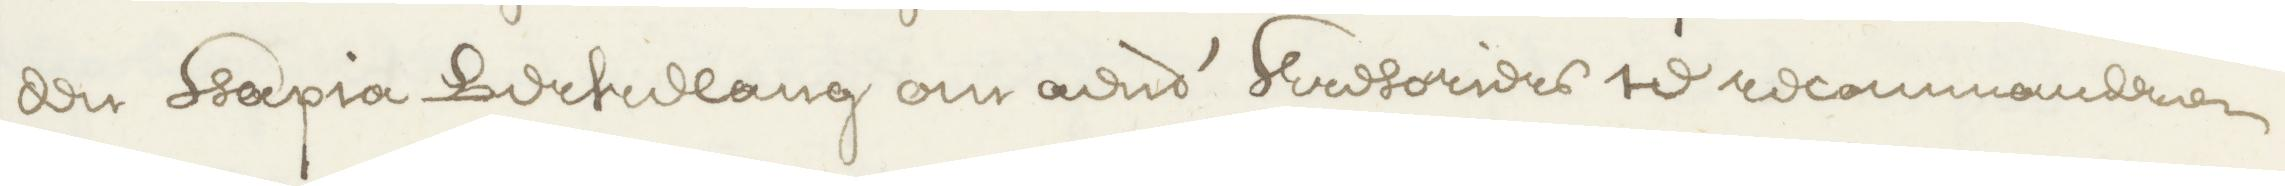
den Tsapia Berkelang om aend' thresoriers te recommanderen
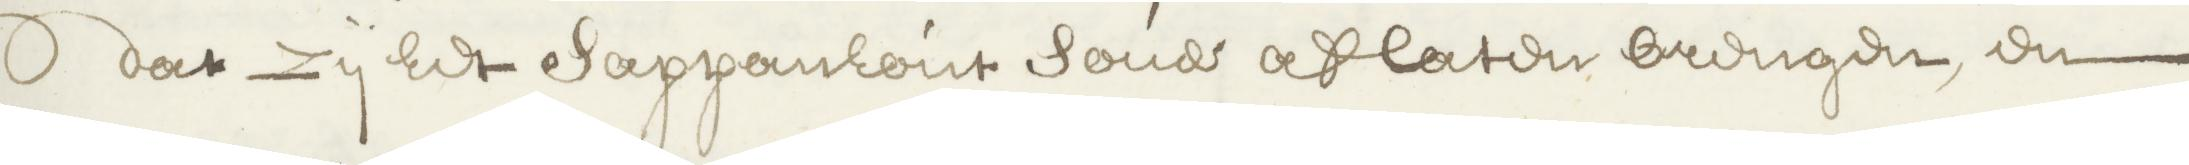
dat zij het sappanhout soude aflaten brengen, en
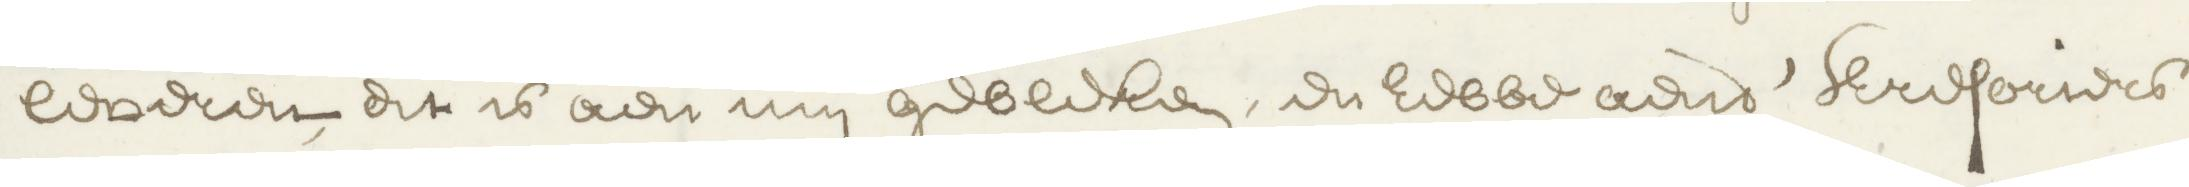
leveren, dit is aen mij gebleken, en hebbe aend' thresoriers
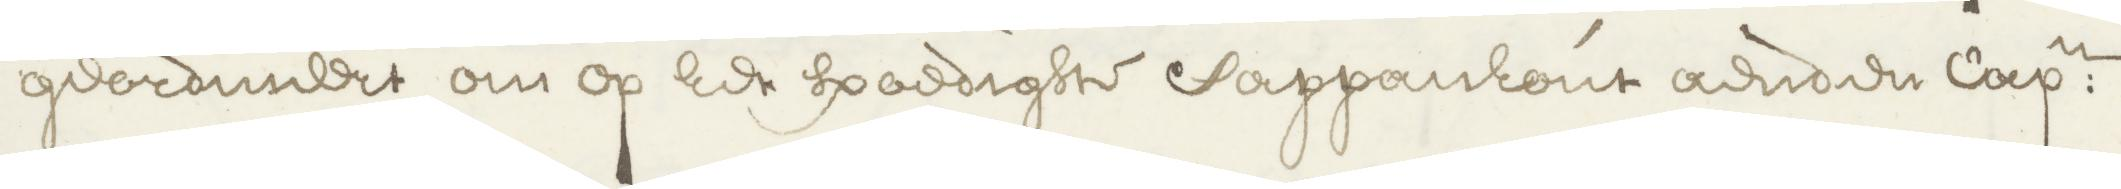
geordineert om op het spoedigste sappanhout aenden Cap:n
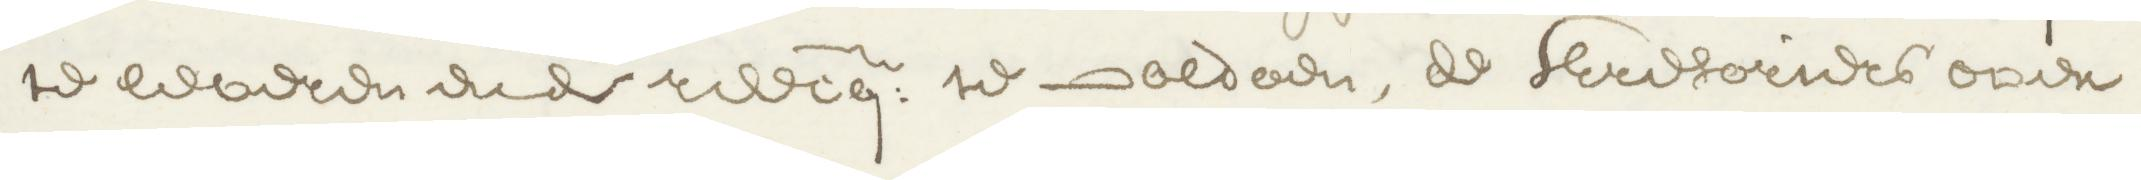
te leveren ende reecq: te voldoen, de thresoriers over
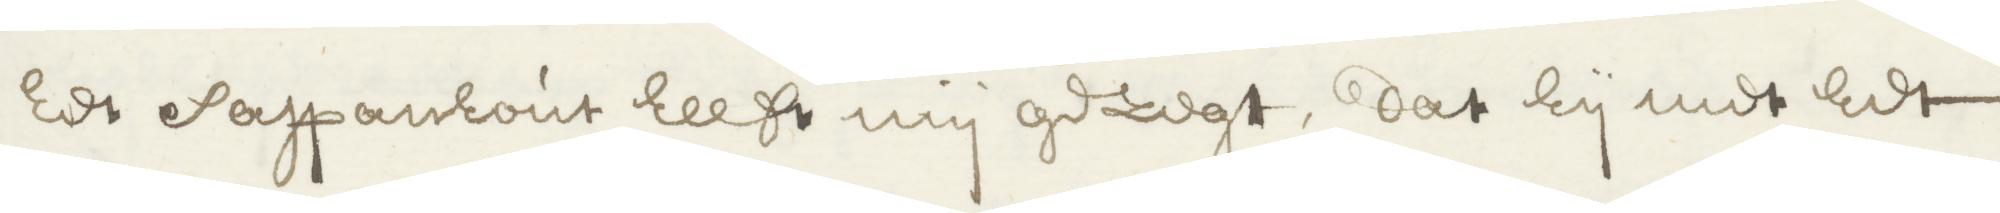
het sappanhout heeft mij gezegt, dat hij met het
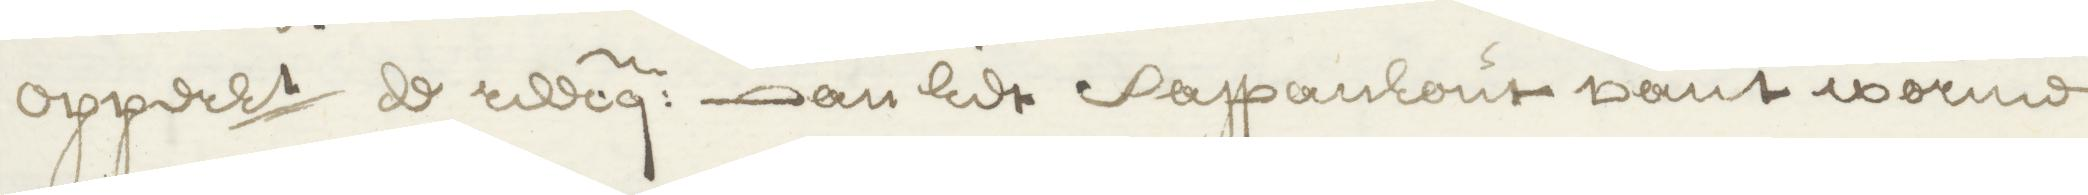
opperh=t de reecq: van het sappanhout van't worme
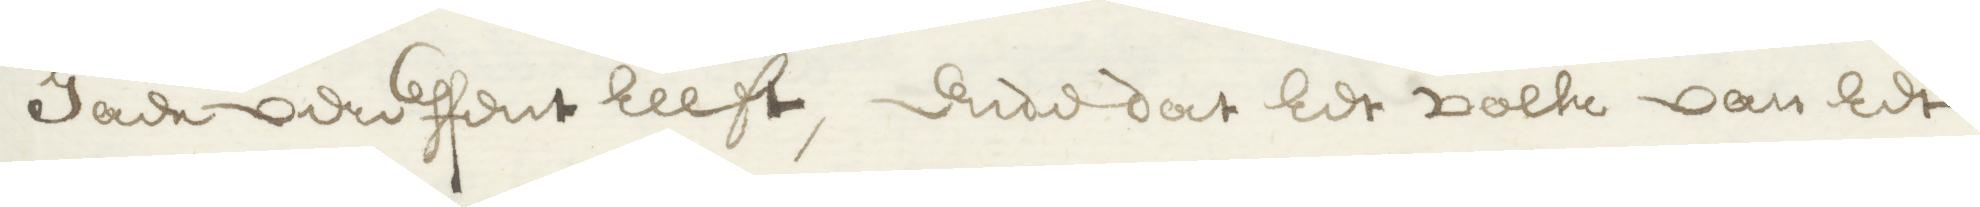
Jaer verEffent heeft, Ende dat het volk van het
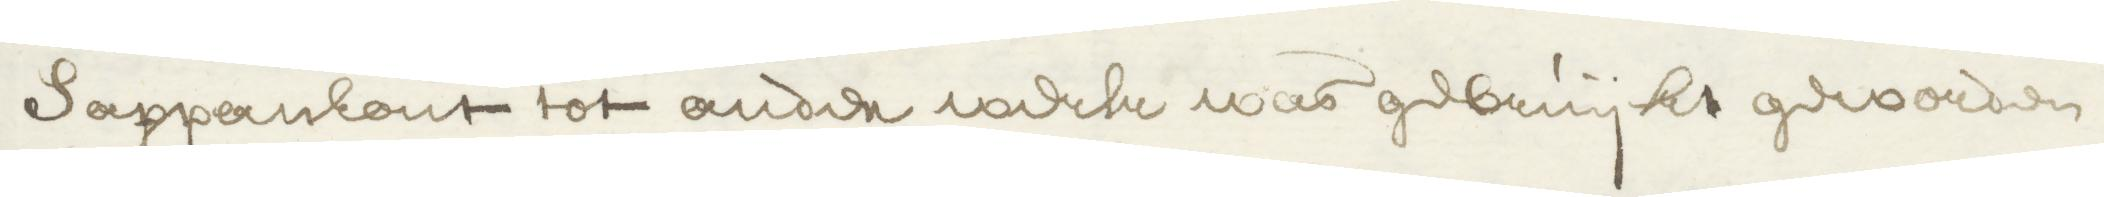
Sappanhout tot ander werk was gebruijkt geworden
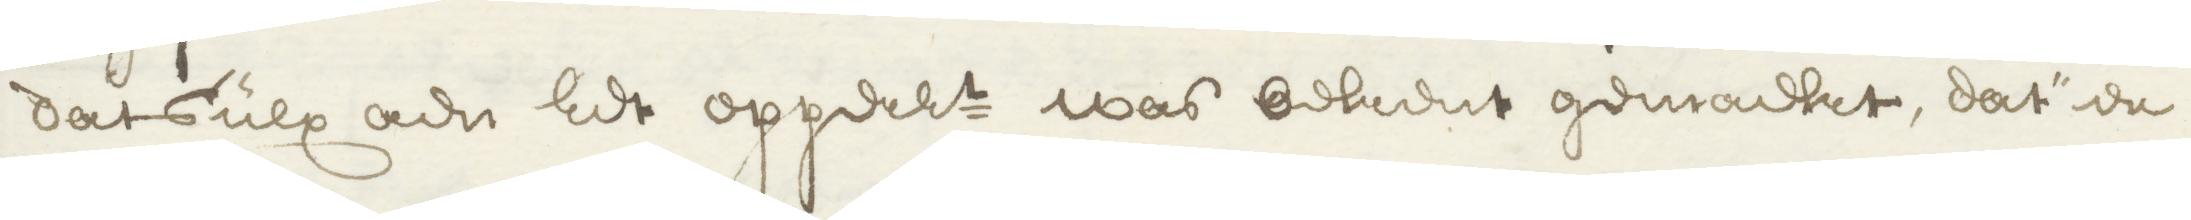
dat sulx aen het opperh=t was bekent gemaekt, dat "er
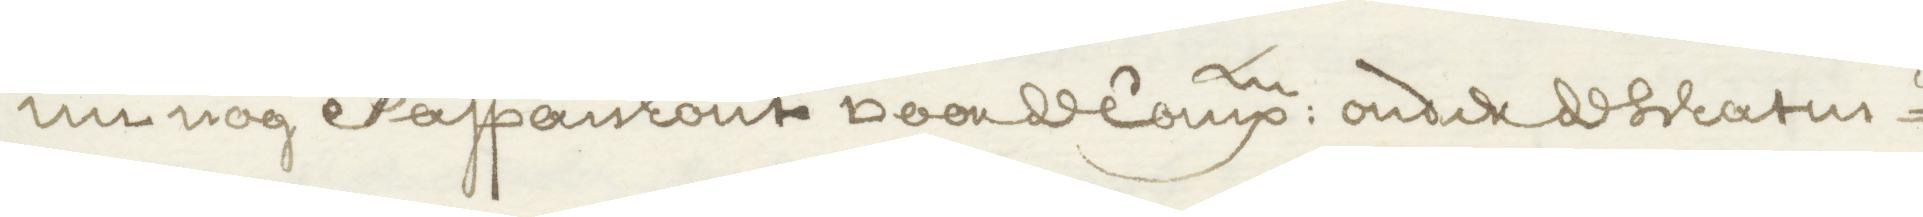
nu nog sappanhout voor de Comp: onder de schatm=rs
